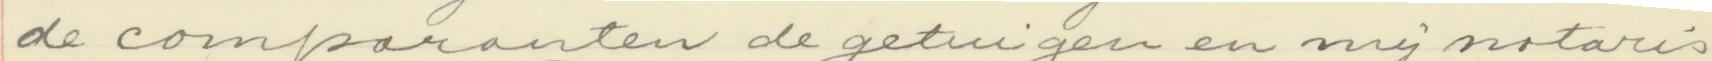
de comparanten de getuigen en mij notaris
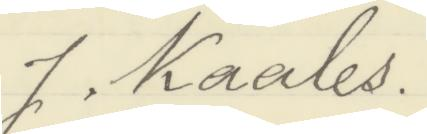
J. Kaales.
